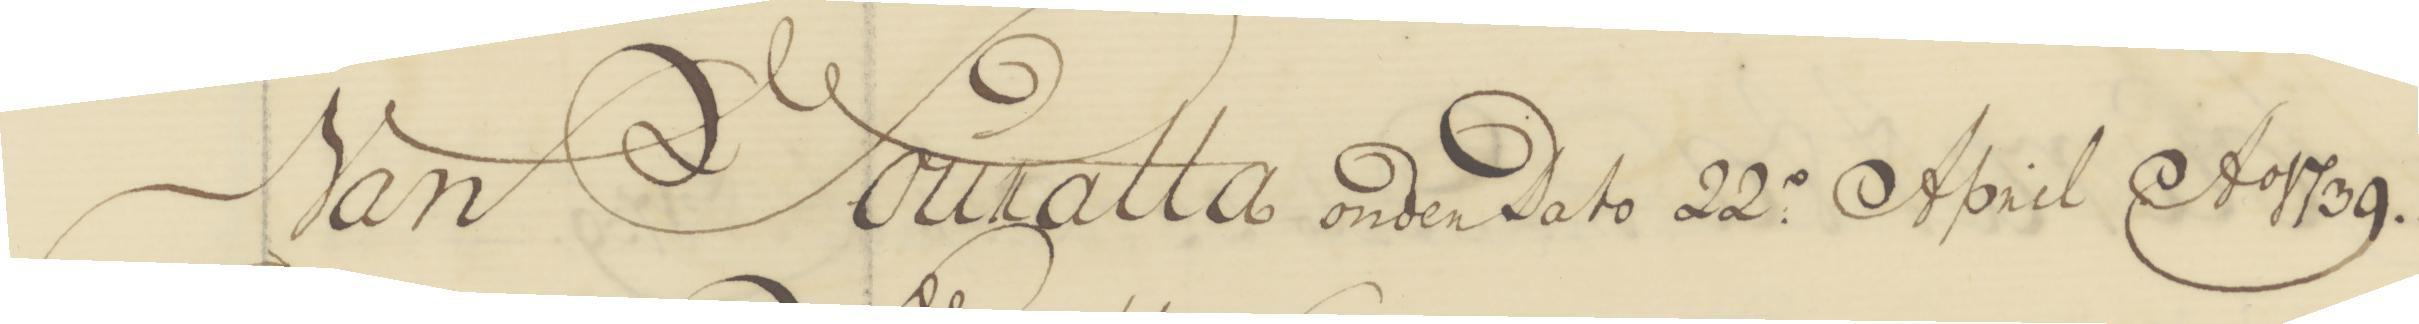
Van Souratta onder Dato 22:e April Ao 1739.
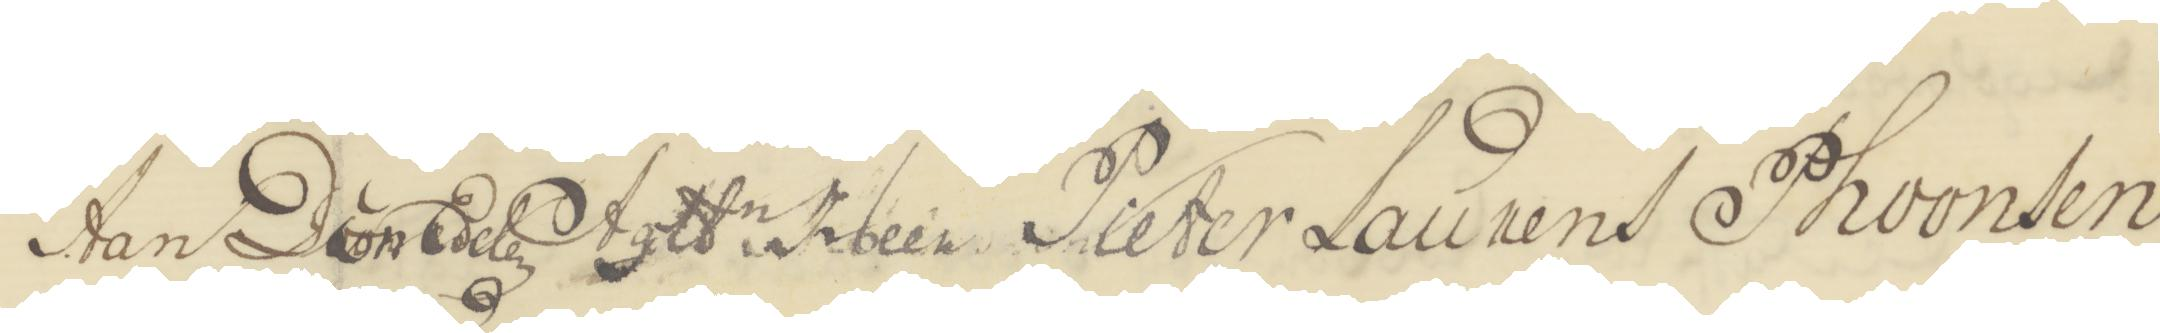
Aan Den Edelen Agtbn Heer Pieter Laurens Phoonsen
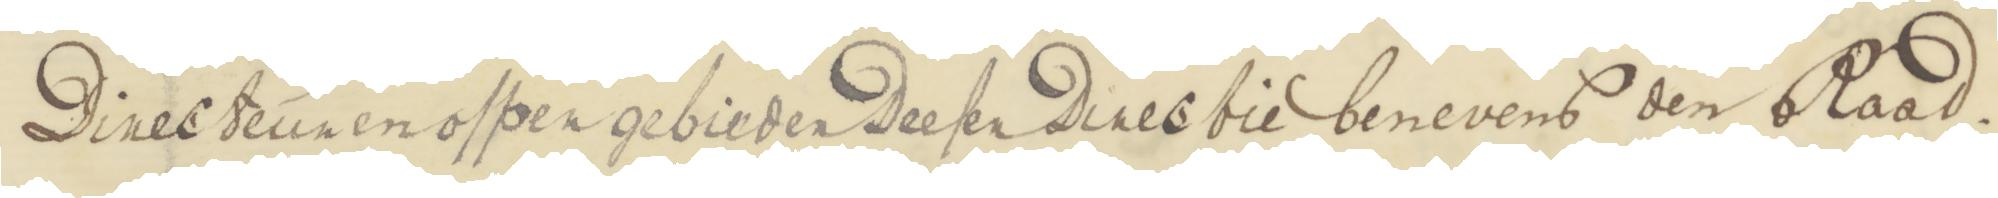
Directeur en opper gebieder Deeser Directie benevens den Raad.
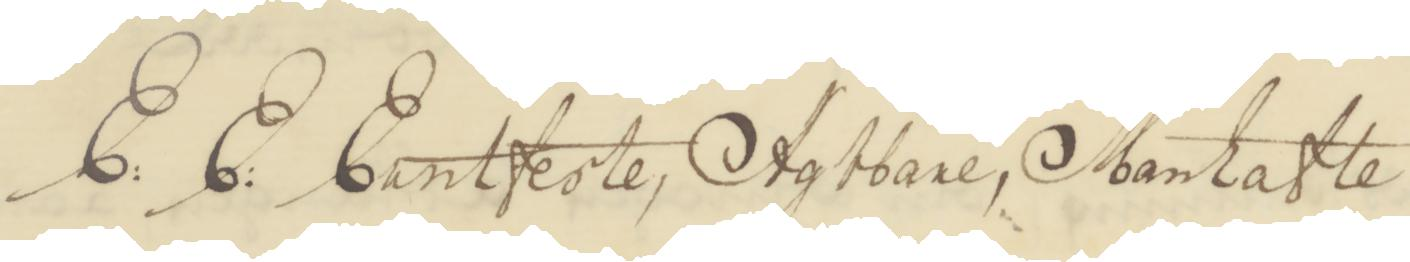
E: E: Erntfeste, Agtbare, Manhafte
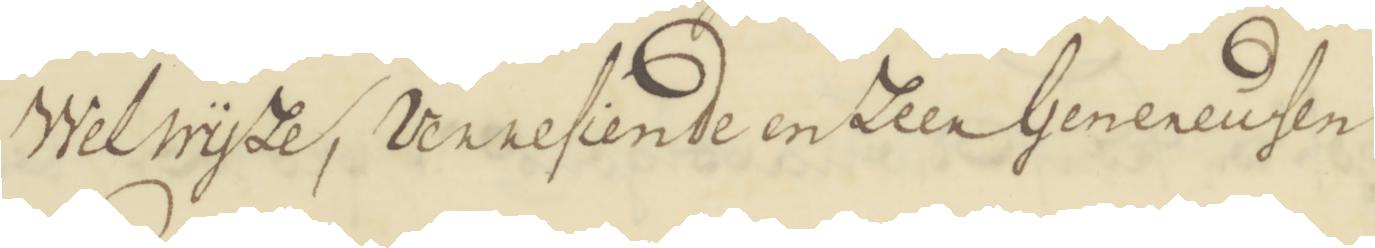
Welwijze, verresiende en zeer Genereusen
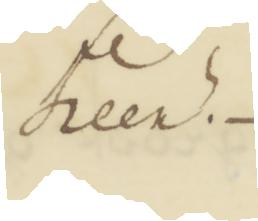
heer. —
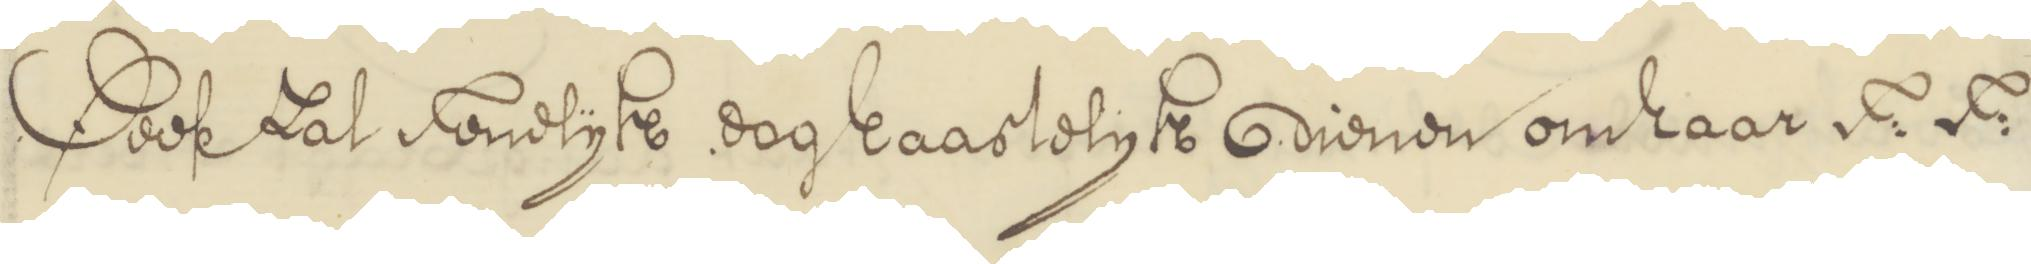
Deese zal Eenelijk dog haastelijk dienen omhaar E: E:
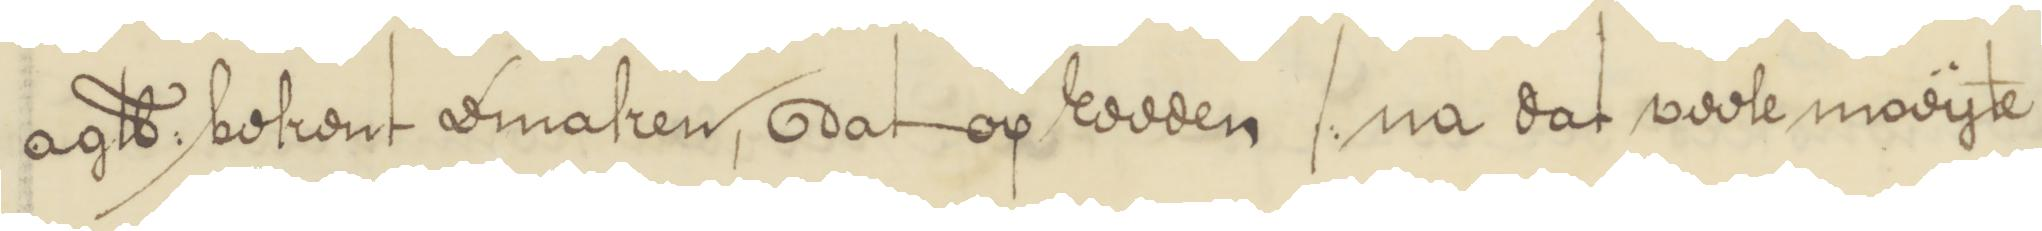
agtb: bekent temaken, dat op heeden /:na dat veele moeijte
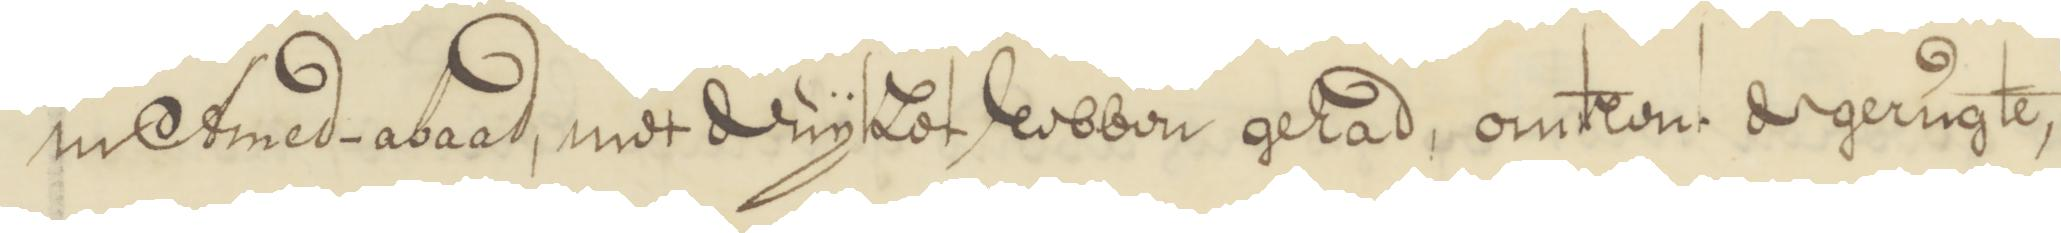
in Amed-abaad, met de uijtzet hebben gehad, omtrent degerugte,
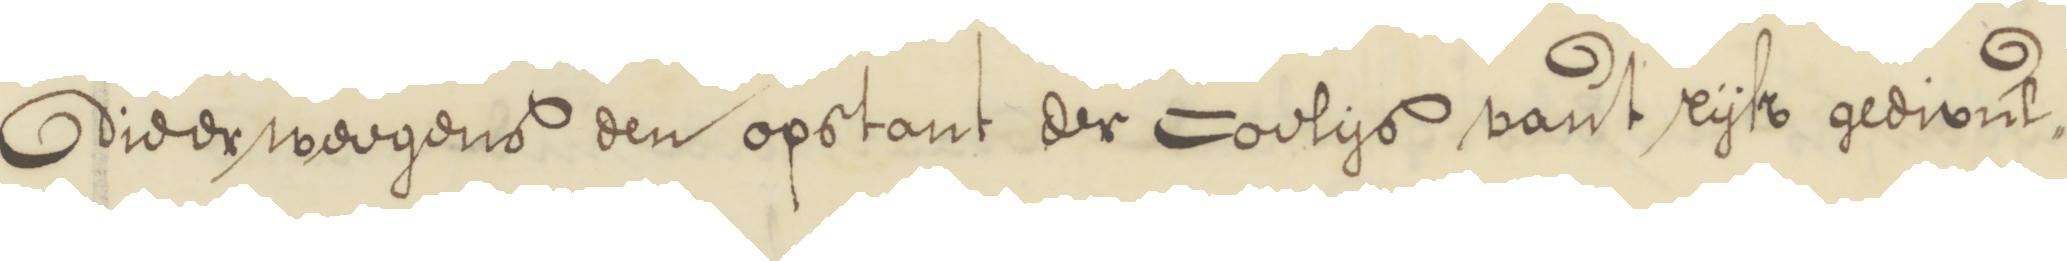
dieer weegens den opstant der coelijs van’t rijk gedivul„
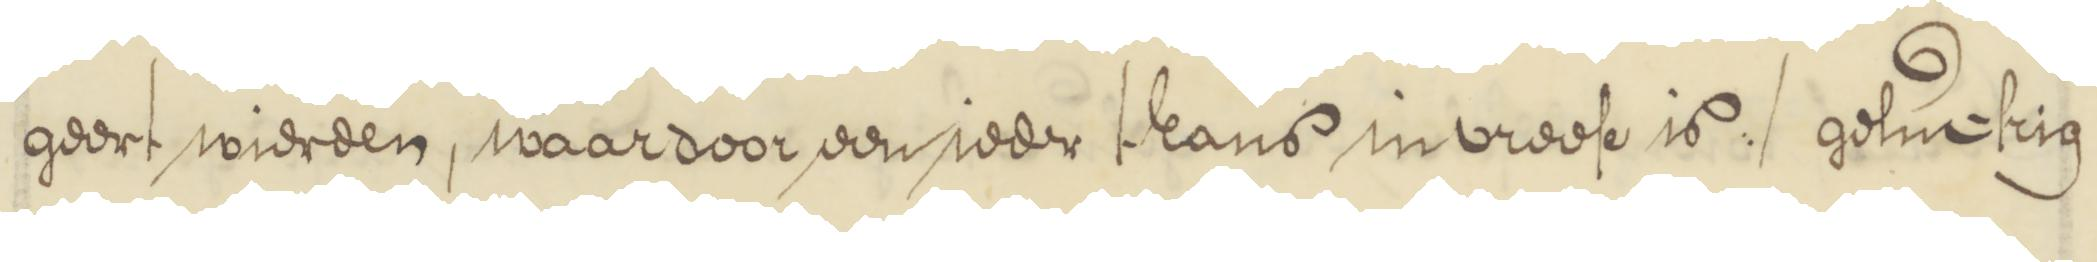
geert wierden, waar door een ieder thans in vreese is :/ geluckig
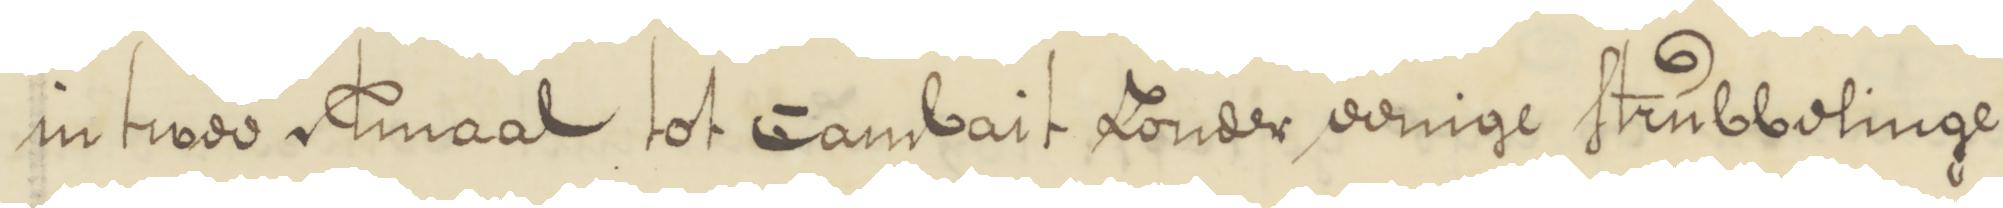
in twee Etmaal tot cambait zonder eenige strubbelinge
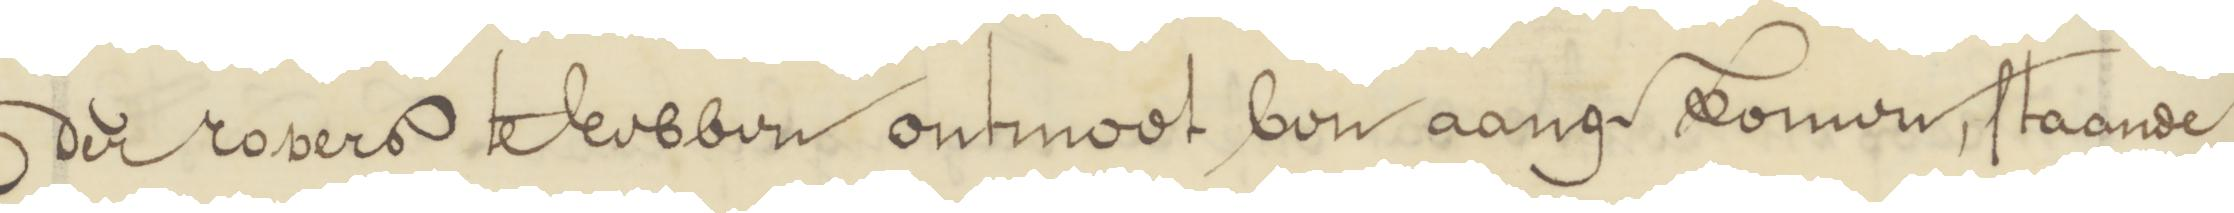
der rovers tehebben ontmoet ben aangekomen, staande
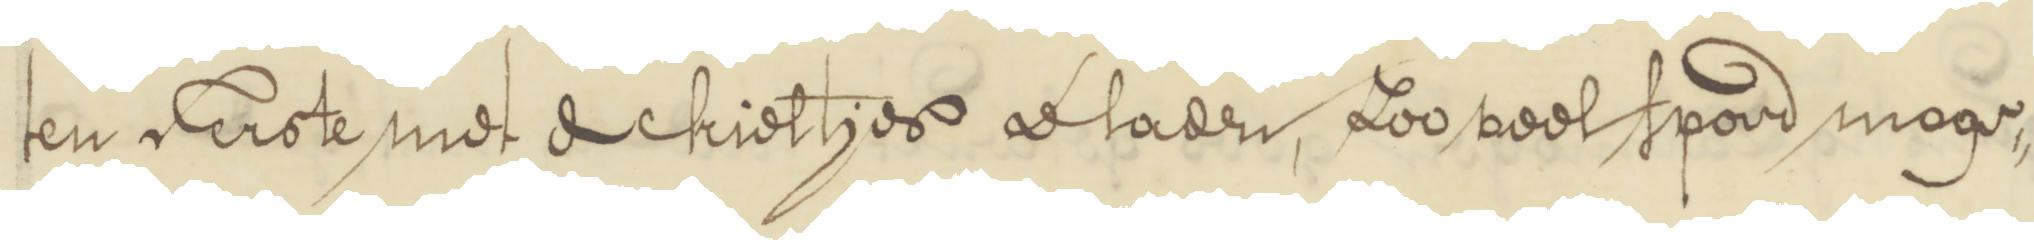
ten Eerste met de kieltjes teladen, zoo veel spoed moge„
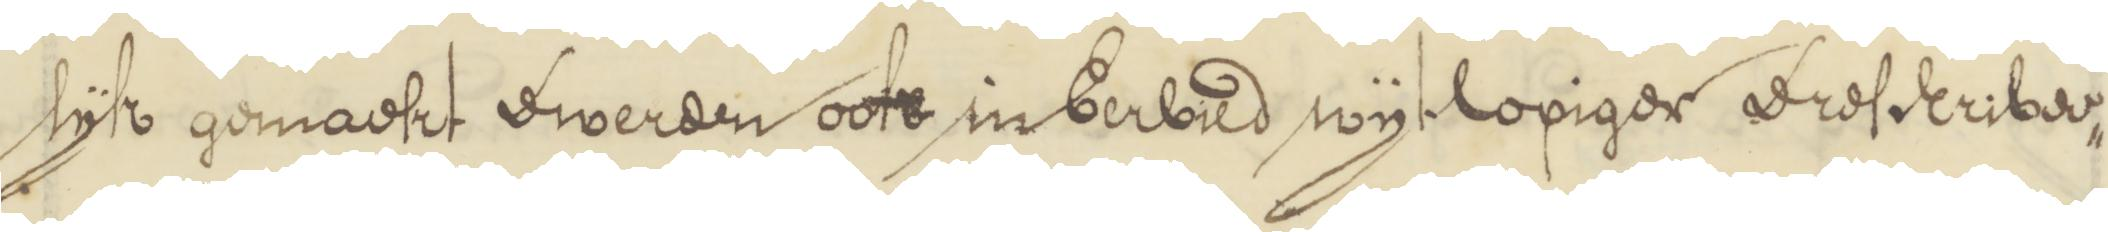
lijk gemaekt tewerden ook in Eerbied wijtlopiger tereschribee„
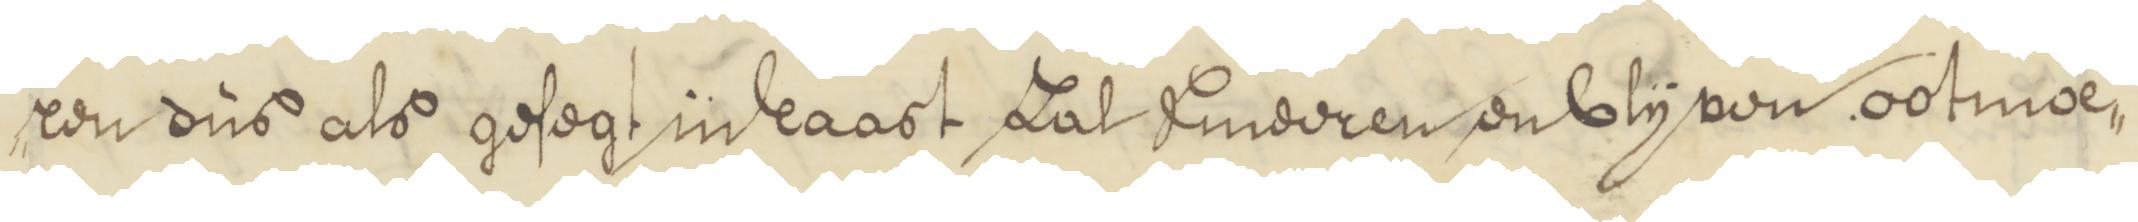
ren dus als gesegt inhaast zal finderen en blijven ootmoe„
